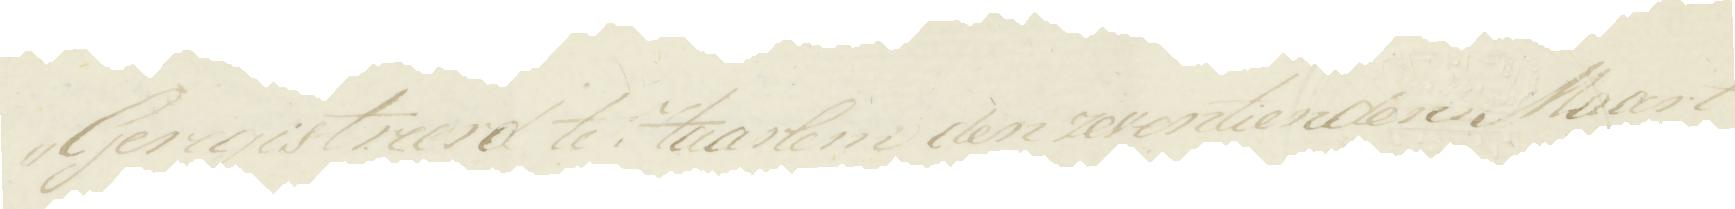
„ Geregistreerd te Haarlem den zeventienden Maart
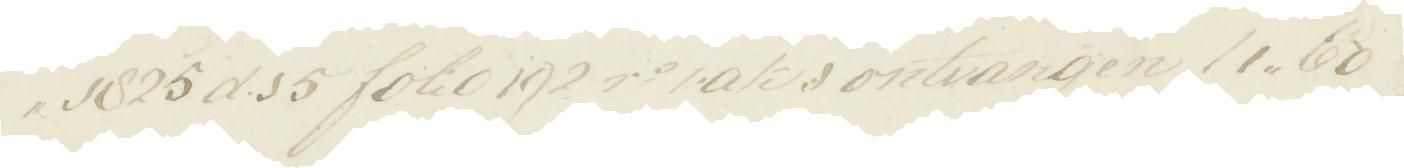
„ 1825 d.5 folio 192 r-o vak 8 ontvangen ƒ1„60
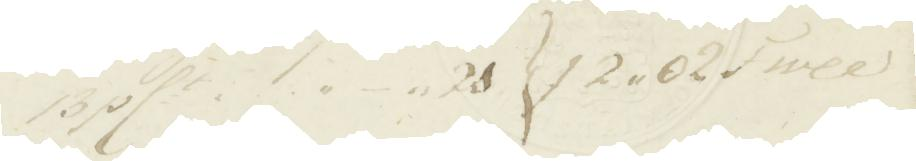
13 pCt . . . „ – „ 21 ƒ 2„02 Twee
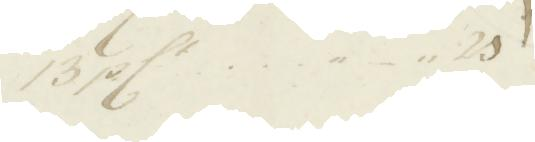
13 pCt . . . „ – „ 21
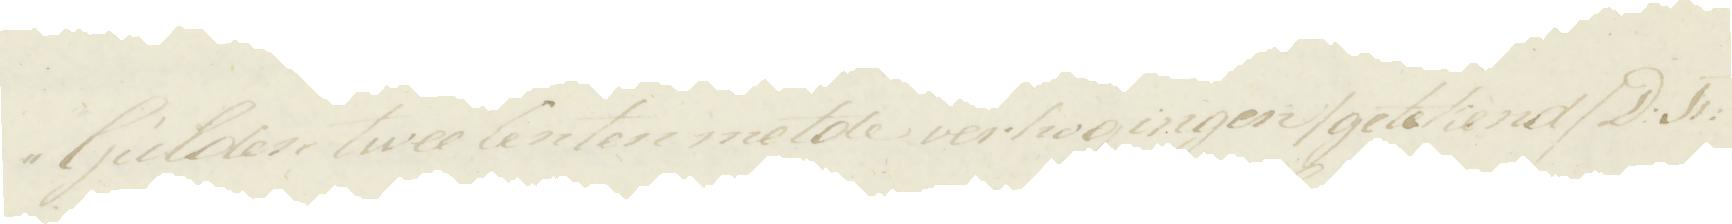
„ Gulden twee Centen met de verhogingen /getekend/ D:F:
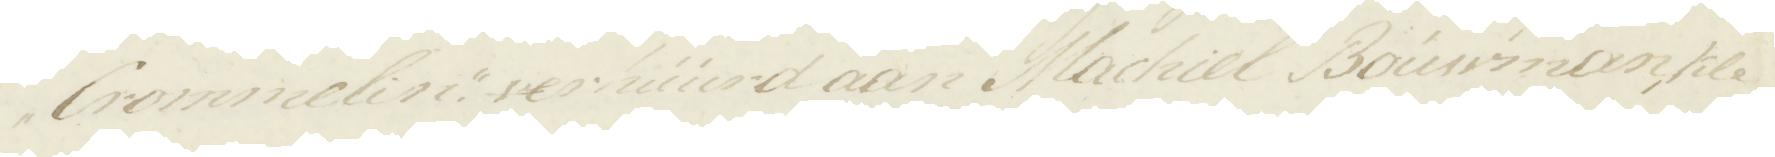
„ Crommelin." verhuurd aan Machiel Bouwman, Kle
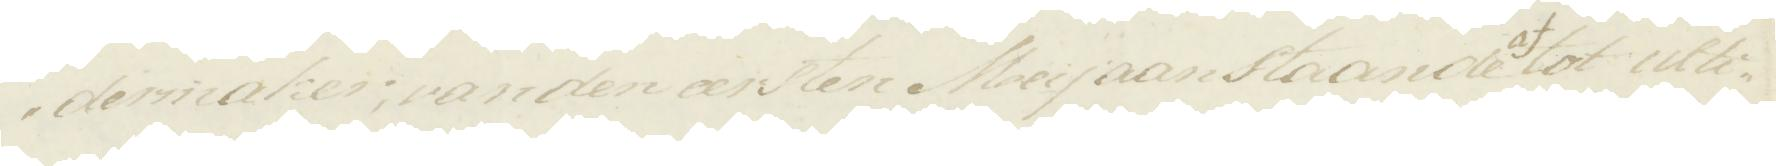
„ dermaker, van den eersten Meij aanstaande tot ulti„
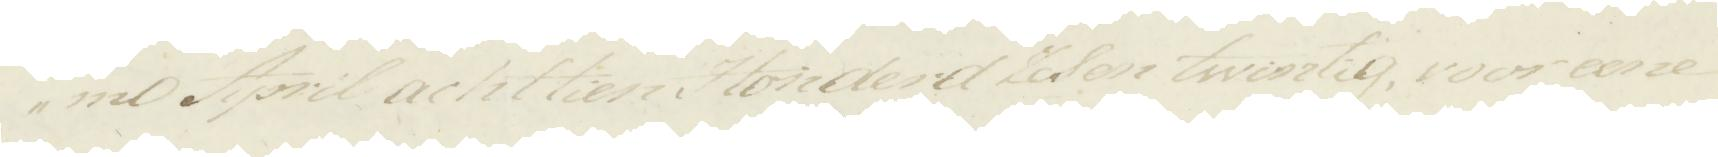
„ mo April achttien Honderd zes en twintig, voor eene
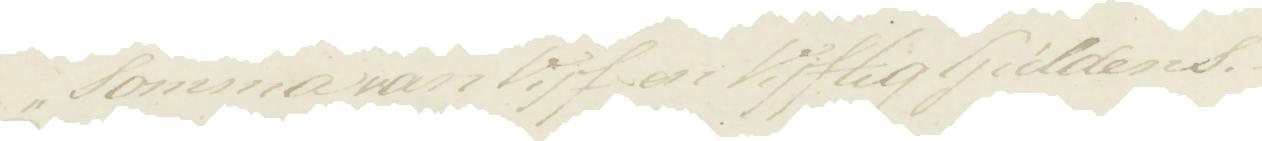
„ somma van Vyf en Vyftig Guldens.
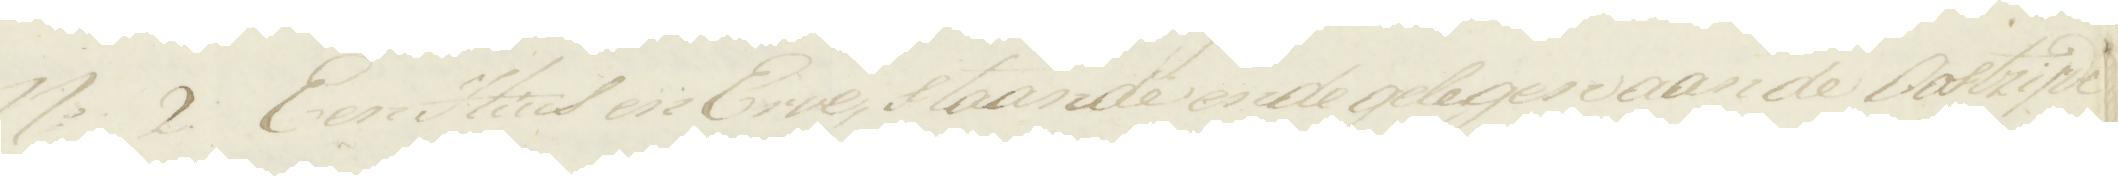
N.o 2: Een Huis en Erve, staande ende gelegen aan de Oostzijde
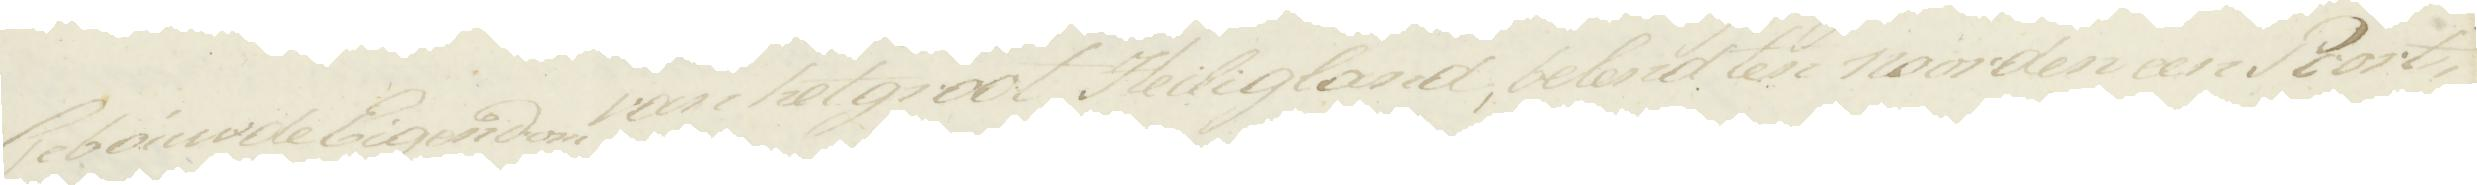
Gebouwde Eigendom van het groot Heiligland, belend ten noorden een Poort,
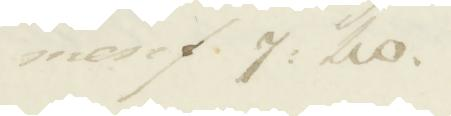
men ƒ. 7: 40.
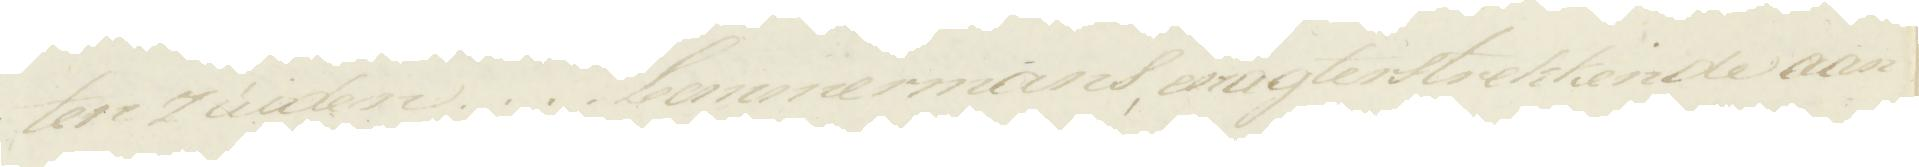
ten zuiden . . . Lemmermans, en agterstrekkende aan
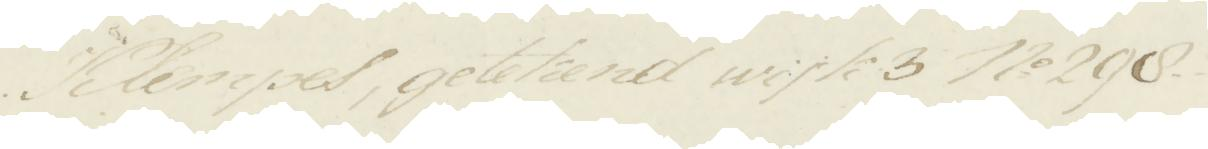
Klempes, getekend wijk 3 N=o 298.
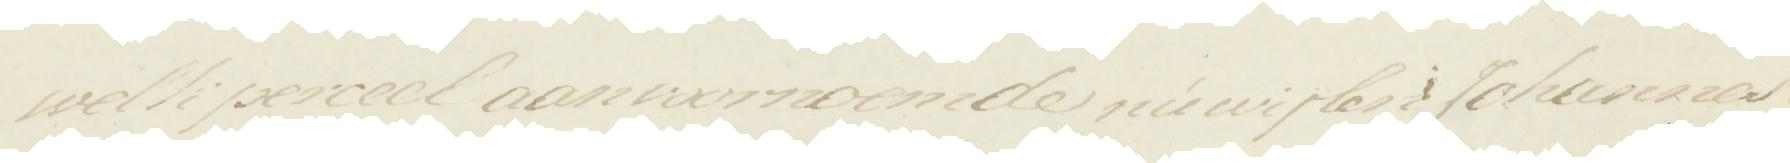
welk perceel aan voornoemde nuwijlen Johannes
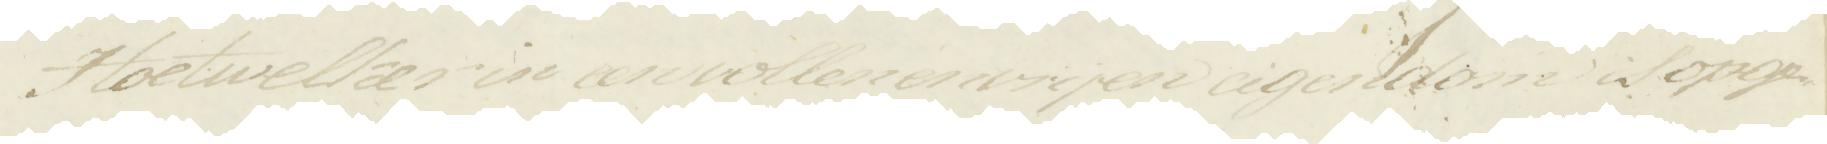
Hoetwelker in een vollen en vrijen eigendom is opge„
